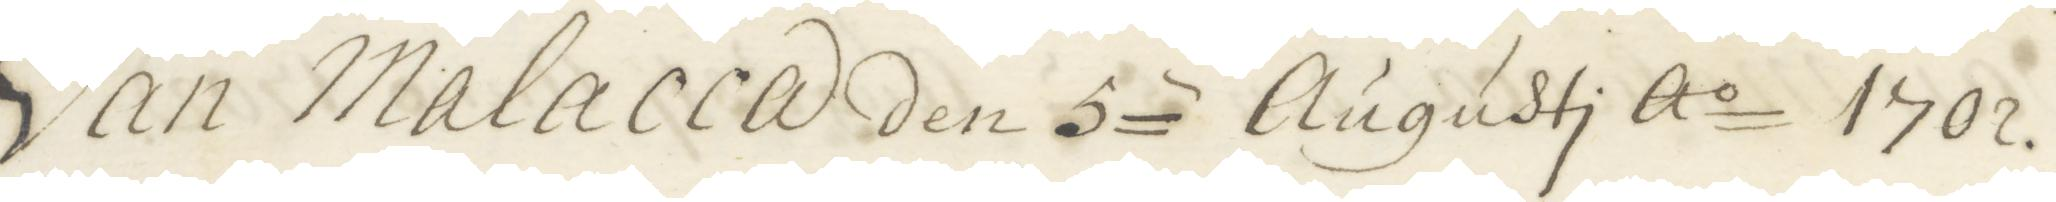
Van Malacca den 5=' Augustj A=o 1702.
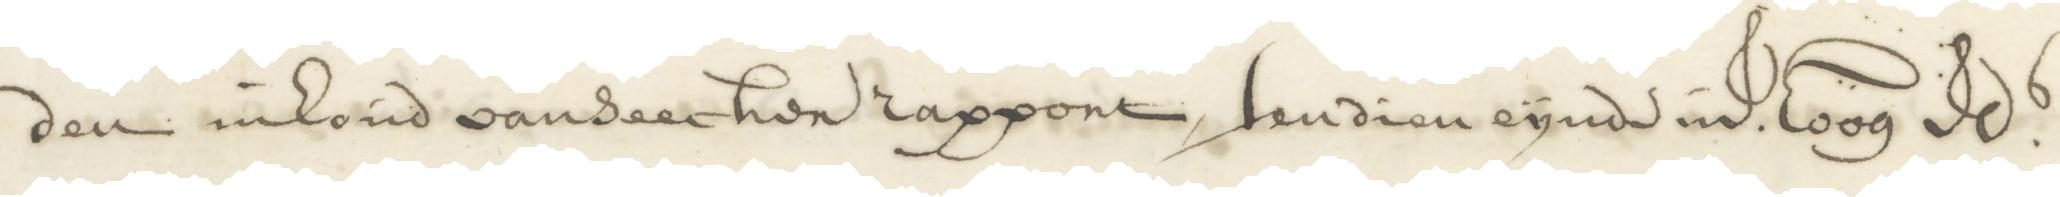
den inhoud van seecker rapport, ten dien eijnde uE. hoog Ed„s
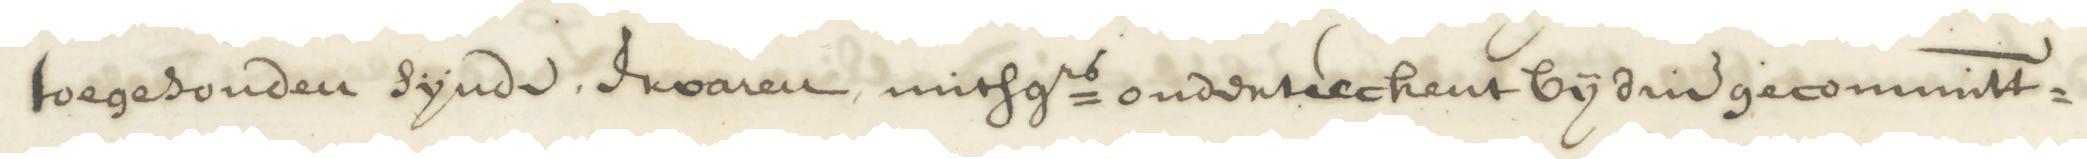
toegesouden sijnde, ervaren, mitsg=rs onderteeckent bij den gecommitt=
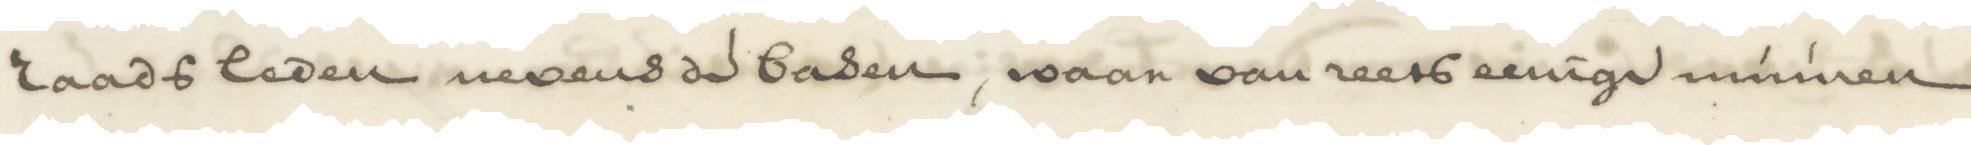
raads leden nevens de basen, waar van reets eenige muuren
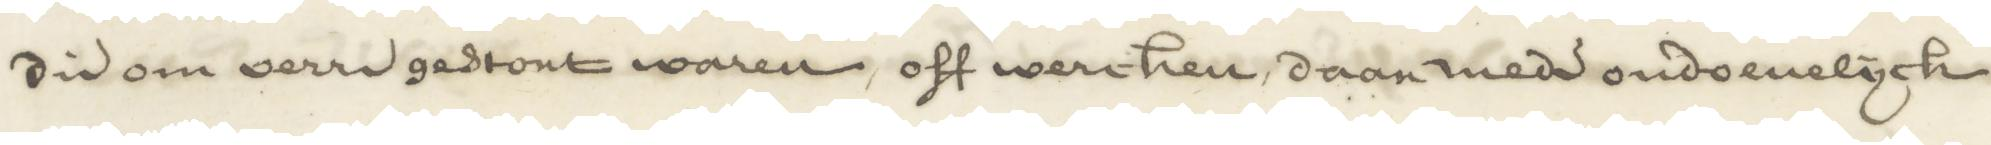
die om verre gestort waren, off wercken, daar mede ondoenelijck
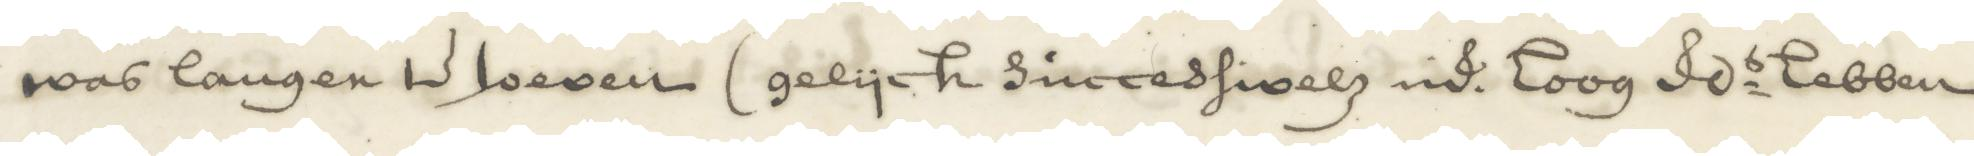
was langer te toeven (gelijck successivelijk uE. hoog Ed=s hebben
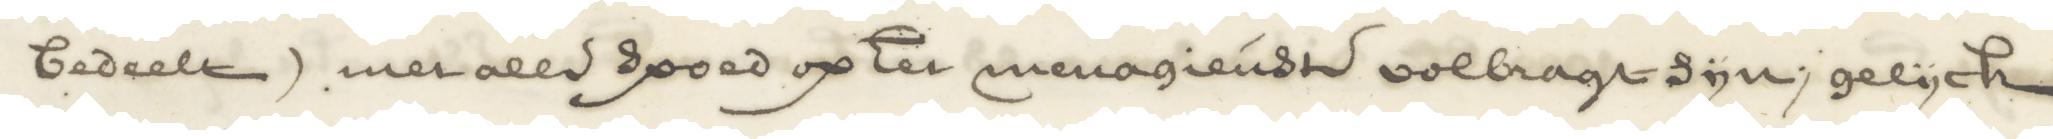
bedeelt) met alle spoed op het menagieuste volbragt sijn; gelijck
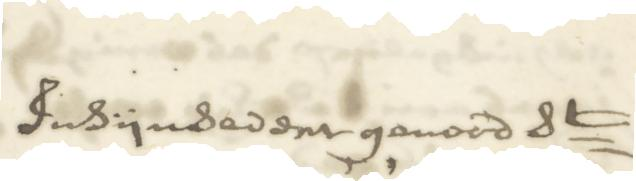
En sijn sedert genood s=t
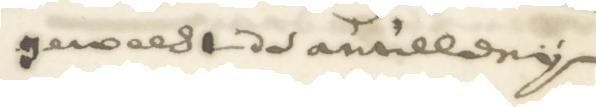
geweest de artillerij
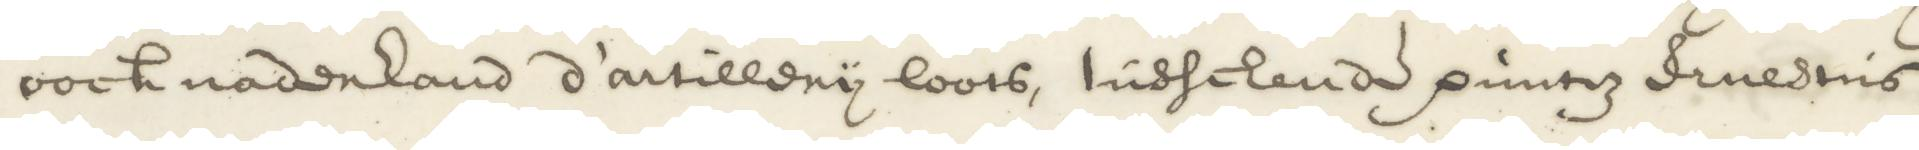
oock naderhand d’artillerij loots, tusschende punten Ernestus
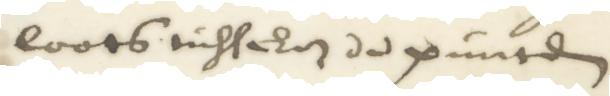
loots tusschen de punten
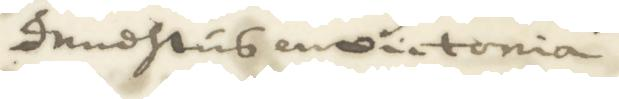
Ernestus en victoria
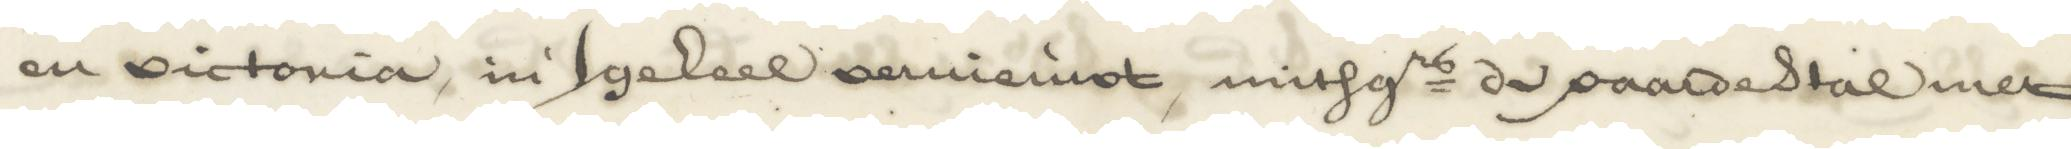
en victoria, in ’t geheel vernieuwt, mitsg=rs de paardestal met
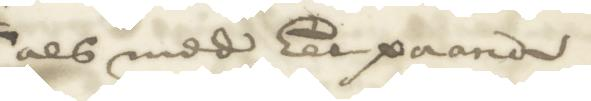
als mede het paarde
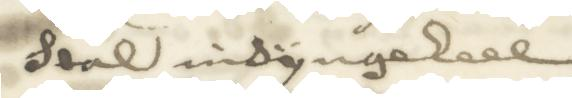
stal in Sijn geheel
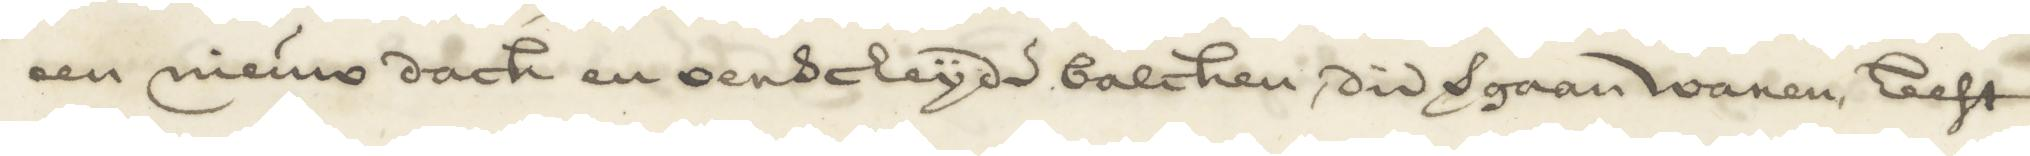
een nieuw dack en verscheijde balcken, die vergaan waren, heeft
